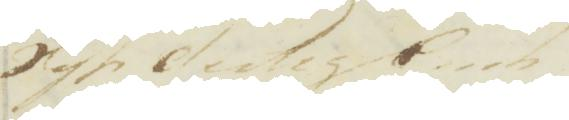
Vijf dertig Cents
